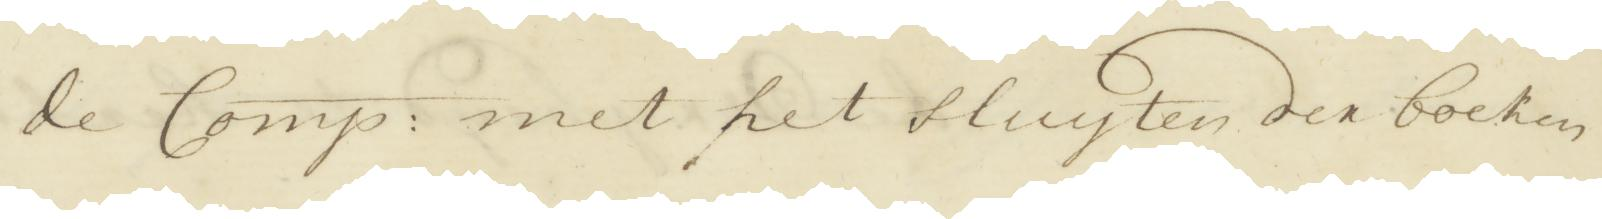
de Comp: met het sluyten der boeken
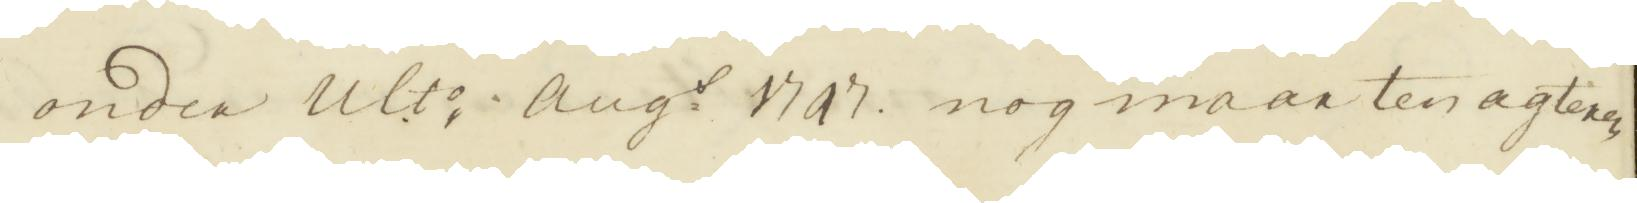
onder ult„o aug=s 1747. nog maar ten agteren
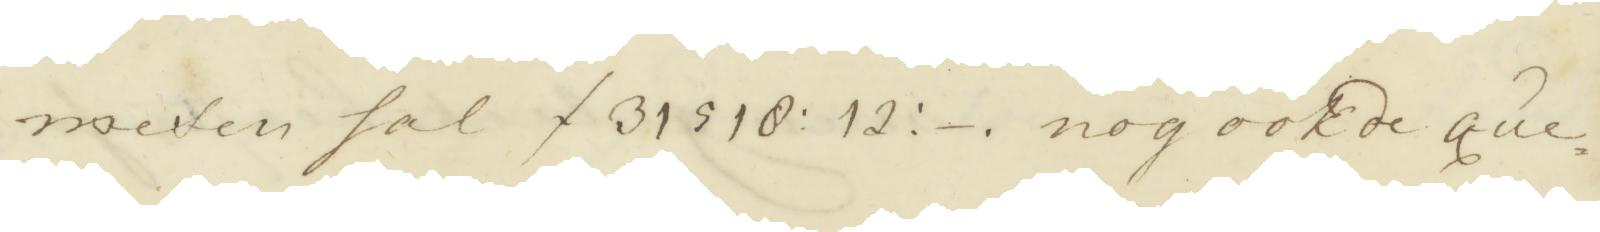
wesen sal ƒ31518: 12:-. nog ook de que=
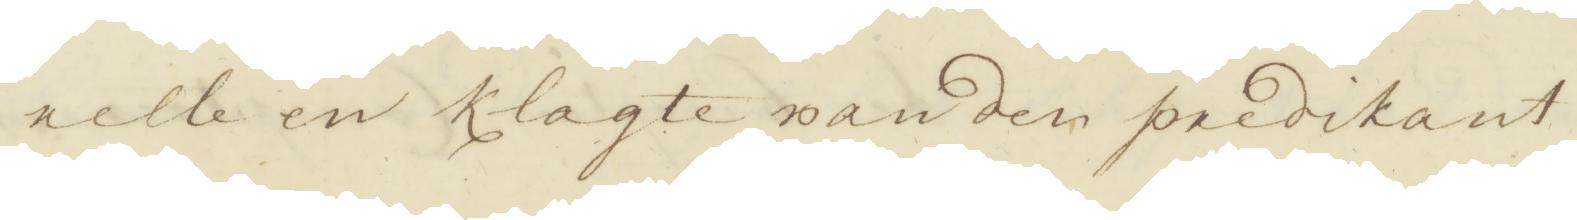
relle en klagte van den predikant
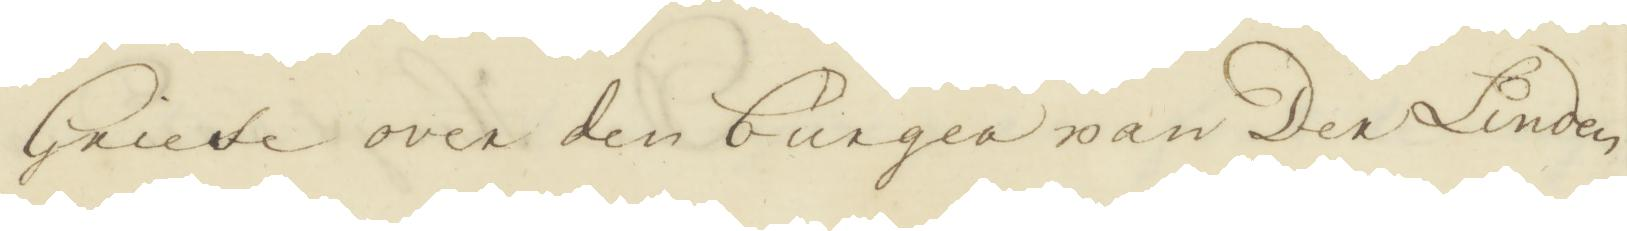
Griete over den burger van Der Linden
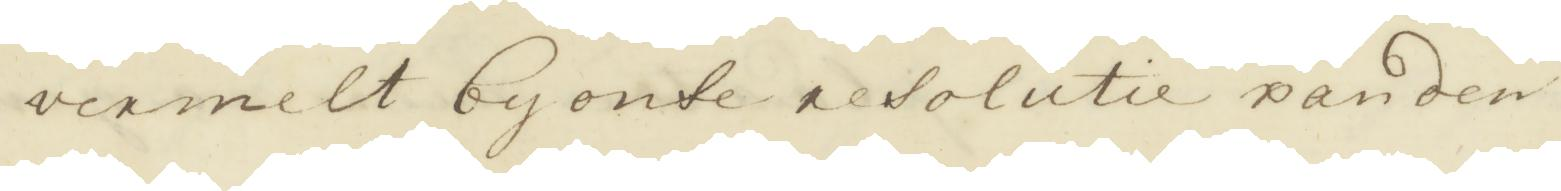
vermelt by onse resolutie van den
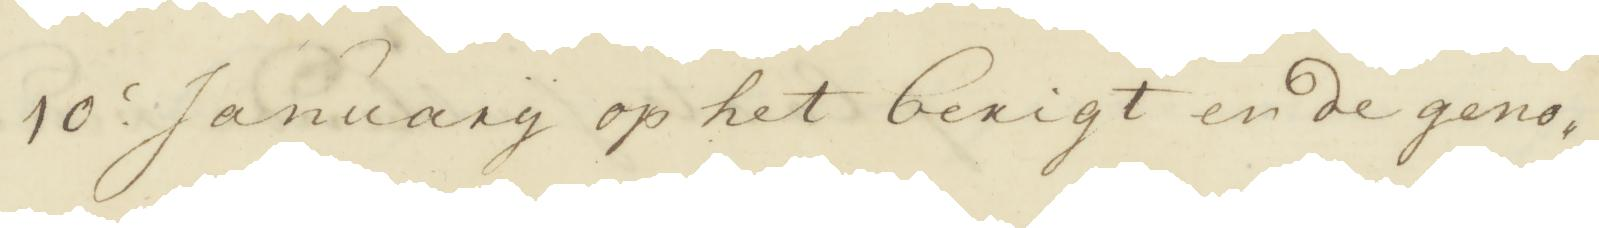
10.' Januarij op het berigt en de geno„
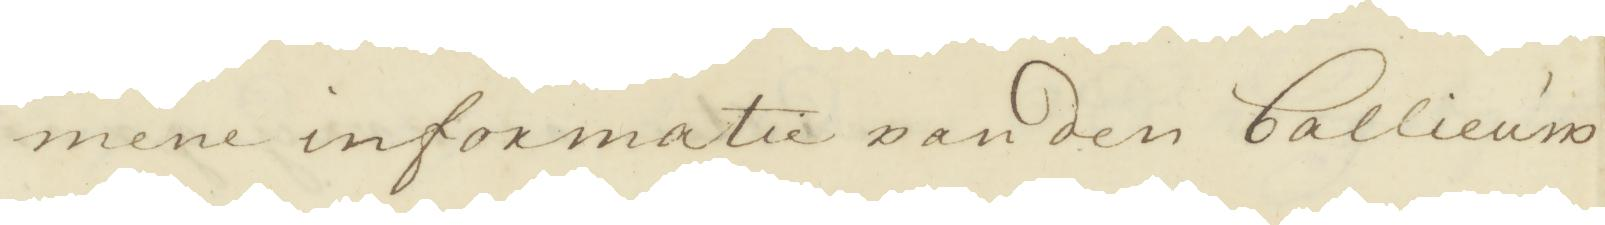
mene informatie van den ballieuw
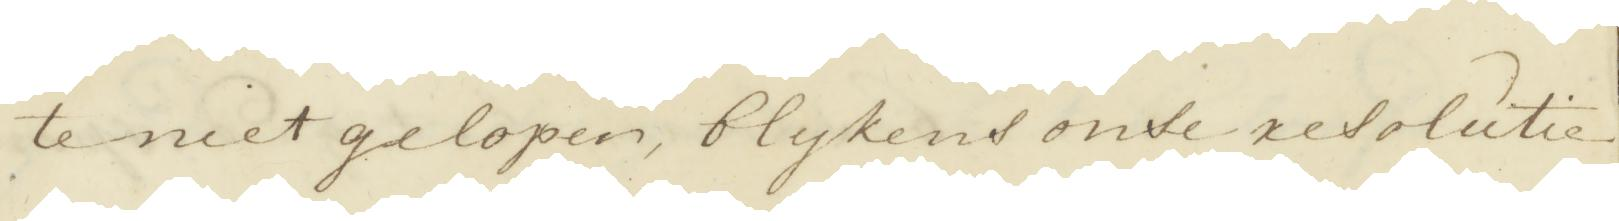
te niet gelopen, blykens onse resolutie
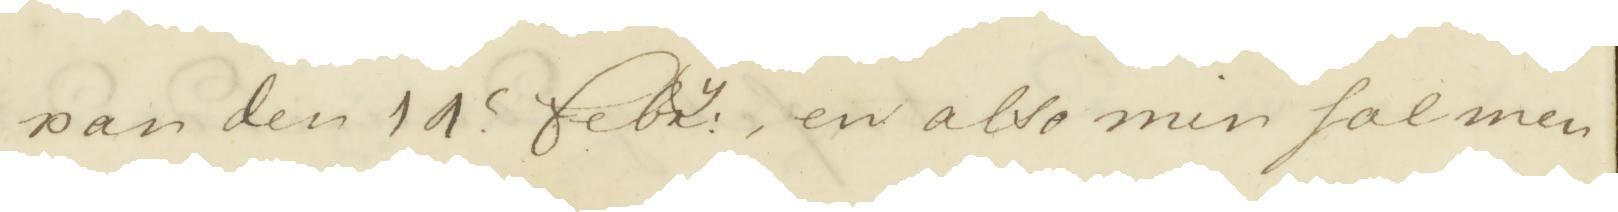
van den 14.' Febr:y, en also min sal men
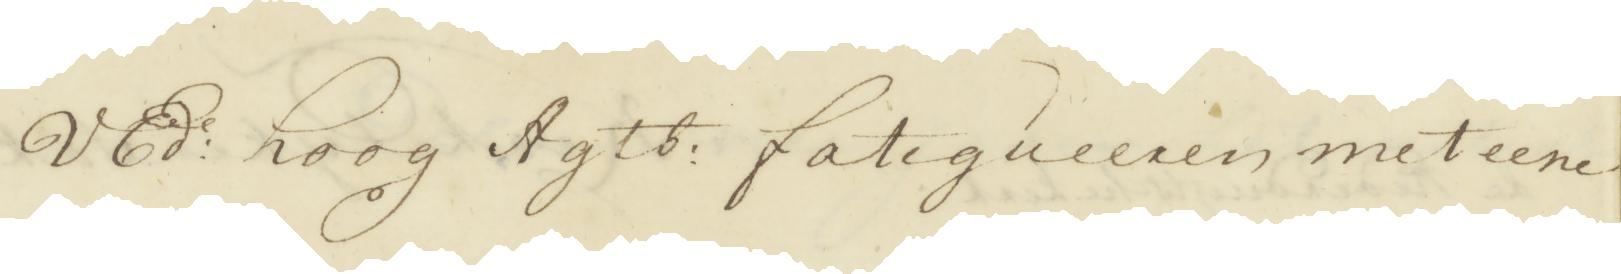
UEd:e hoog Agtb: fatigueeren met eene
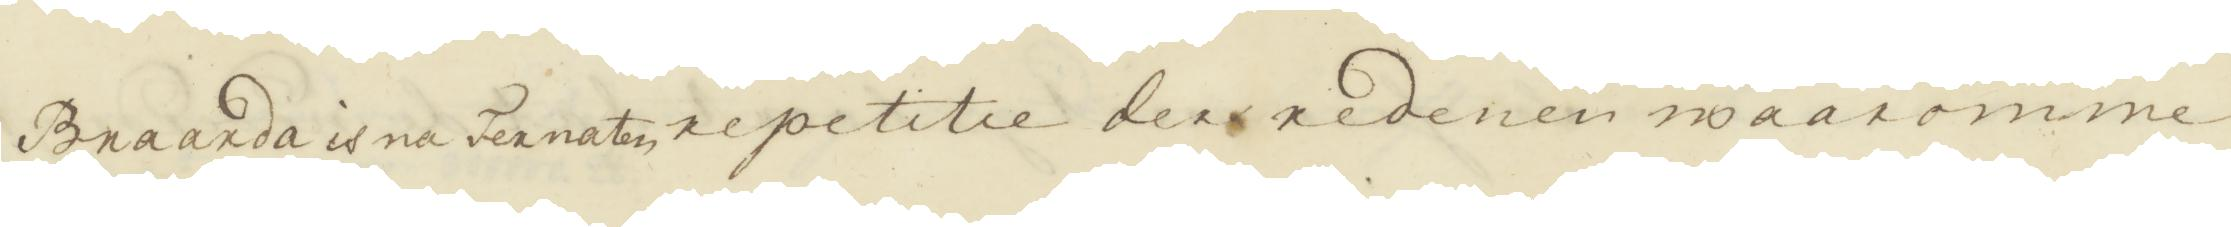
Braarda is na Ternaten repetitie der redenen waaromme
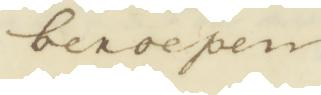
beroepen
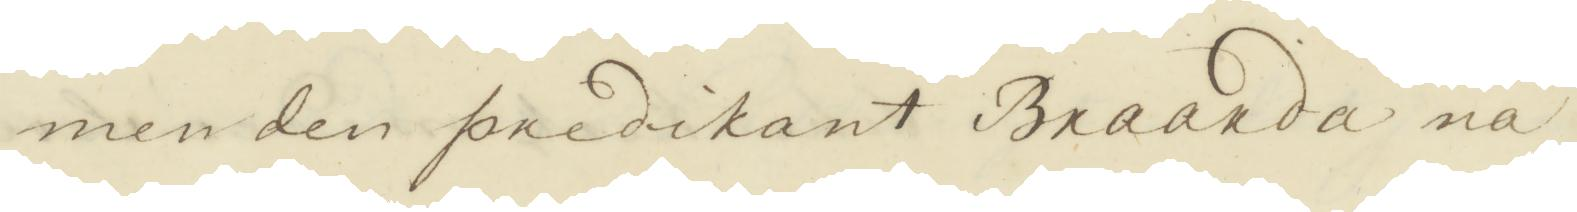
men den predikant Braarda na
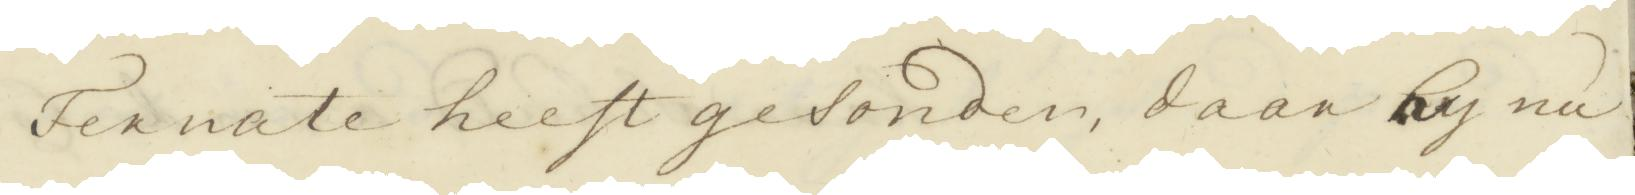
Ternate heeft gesonden, daar hy nu
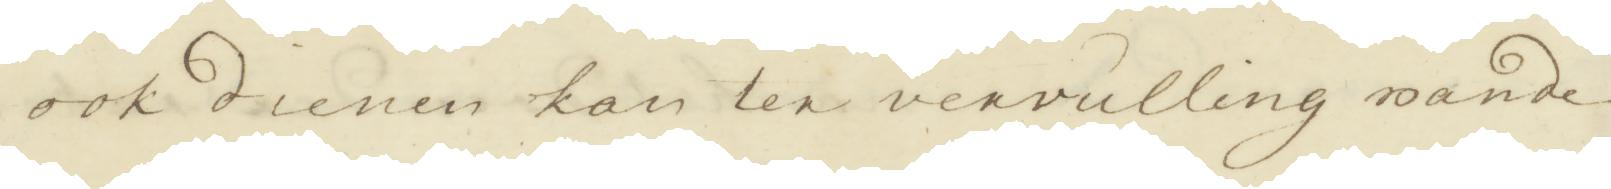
ook dienen kan ter vervulling vande
